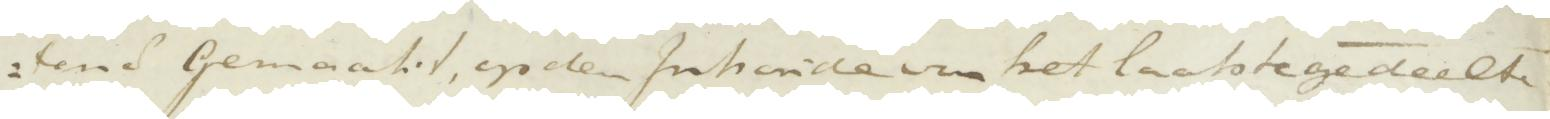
„tens Gemaakt, op den Jnhoude van het laatste gedeelte
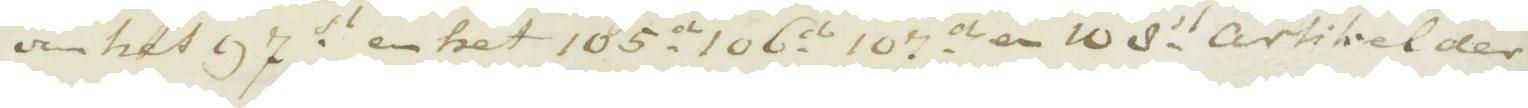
van het 97.st en het 105.de 106.de 107.de en 108.st artikel der
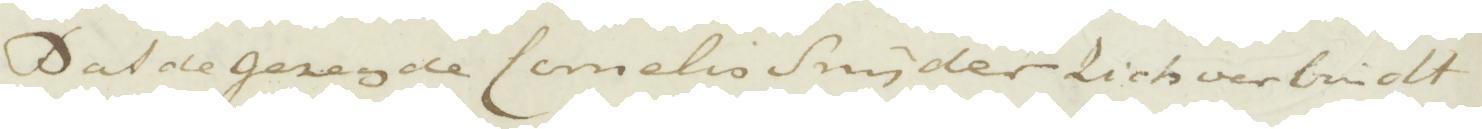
Dat de gezegde Cornelis Snijder zich verbindt
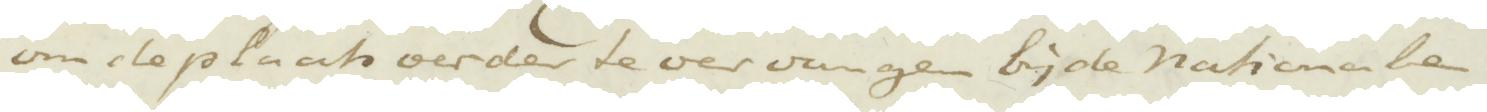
om de plaats verder te vervangen by de nationale
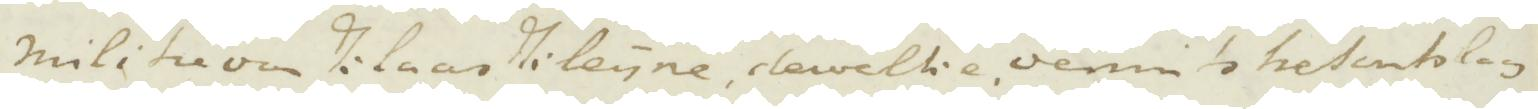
militie van Klaas Kleijne, dewelke vermits het ontslag
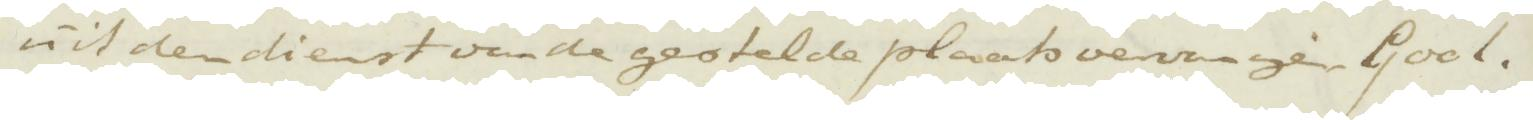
uit den dienst van de gestelde plaatsvervanger Goet.
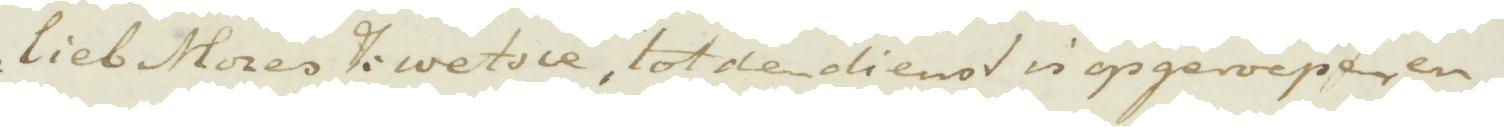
:lieb Mores kwetsie, tot den dienst is opgeroepen, en
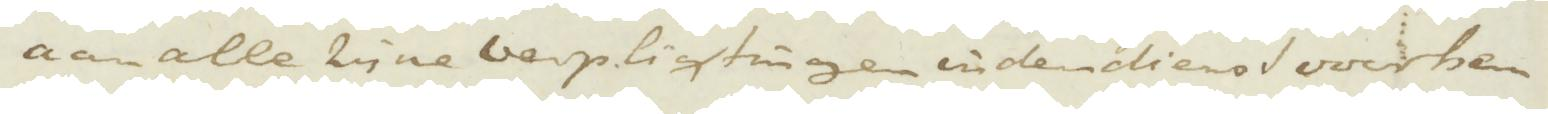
aan alle zijne verpligtingen in den dienst voor hem
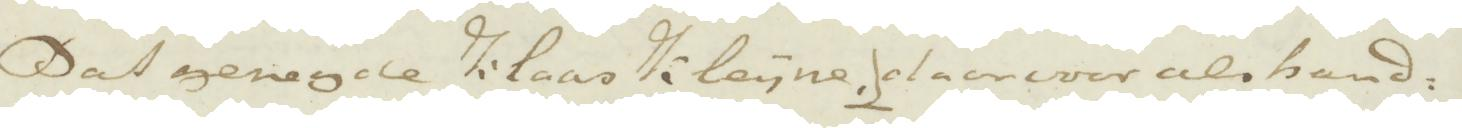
Dat gezegde Klaas Kleijne daarvoor als hand:
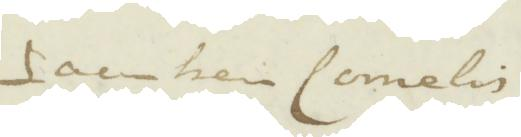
aan hem Cornelis
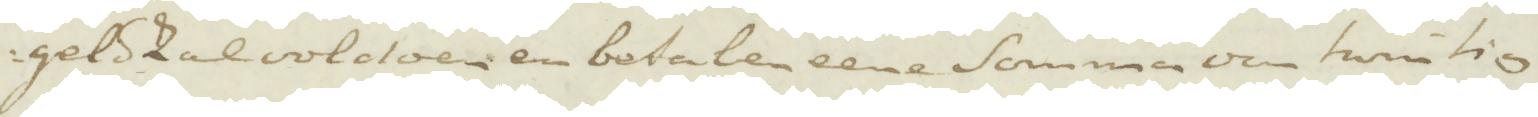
:gels zal voldoen en betalen eene somma van twintig
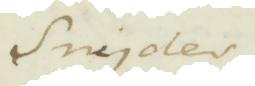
Snijder
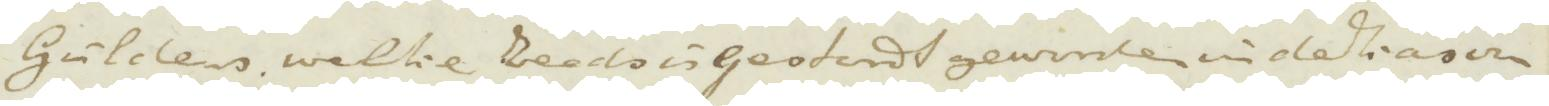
Guldens, welke reeds is gestordt geworden in de kas van
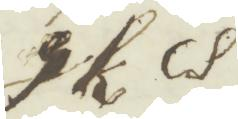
JK CS
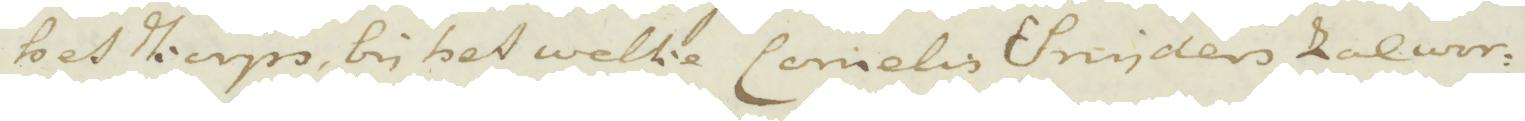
het korps, bij het welke Cornelis Snijders zal wor:
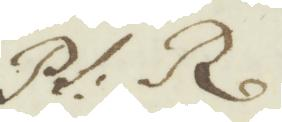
Ps: R
